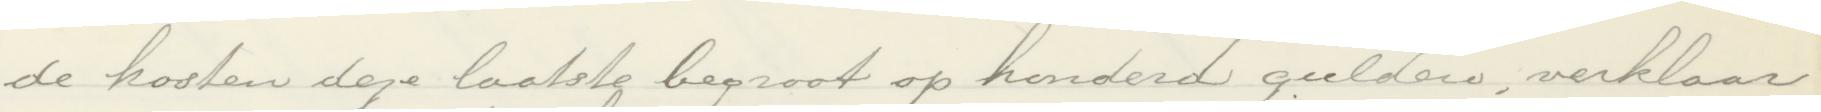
de kosten deze laatste begroot op honderd gelden, verklaar
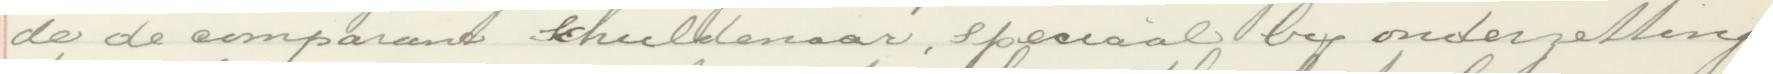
de de comparant schuldenaar, speciaal by onderzetting
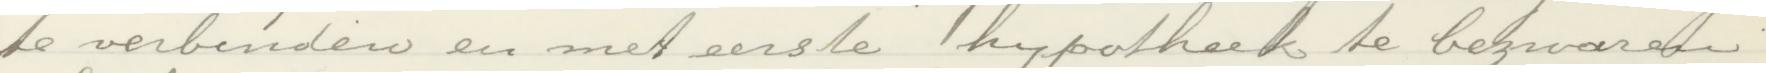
te verbinden en met eerste hypotheek te bezwaren
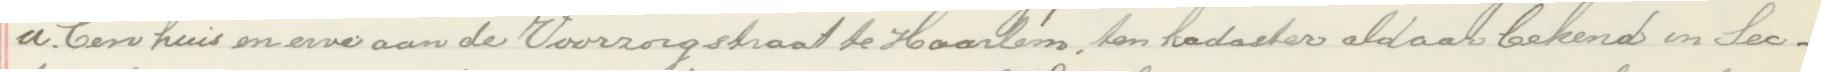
a. Een huis en erve aan de Voorzorgstraat te Haarlem, ten kadaster aldaar bekend in Sec-
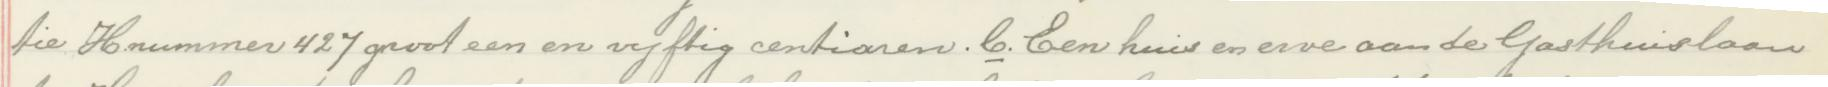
tie H nummer 127 groot een en vijftig centiaren. b. Een huis en erve aan de Gasthuislaan
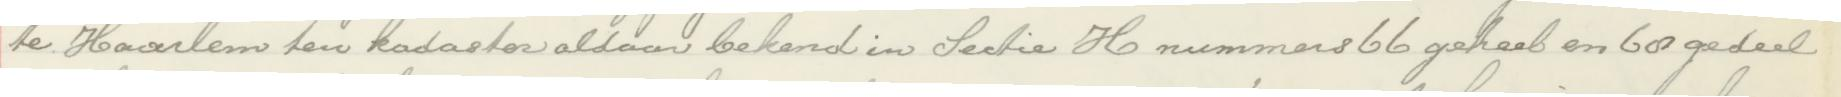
te Haarlem ten kadaster aldaar bekend in sectie H nummers 66 geheel en 68 gedeel
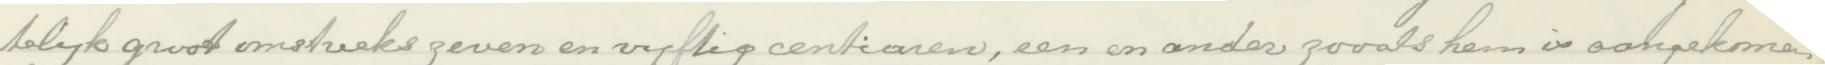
telyk groot omstreeks zeven en vyftig centiaren, een en ander zooals hem is aangekomen
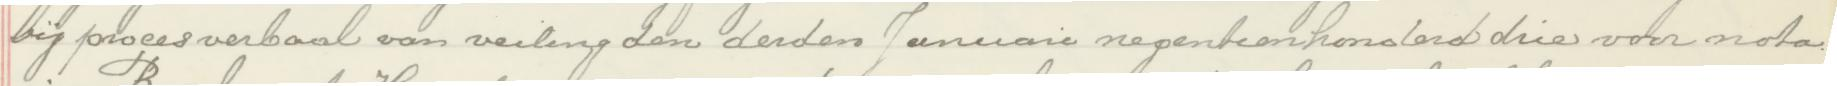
bij procesverbaal van veiling den derden Januarie negentien honderd drie voor nota
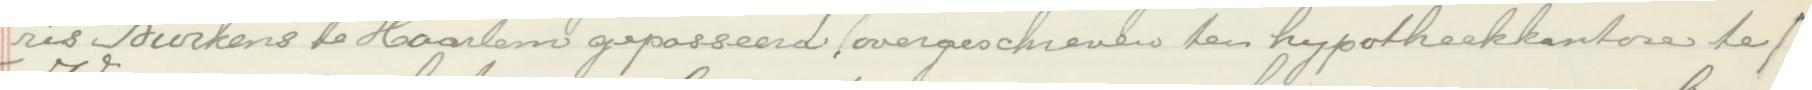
ris Burkens te Haarlem gepasseerd / overgeschreven ten hypotheekkantore te ¶
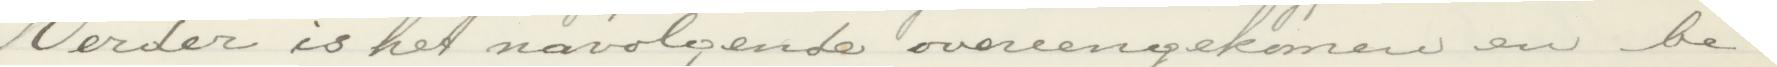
Verder is het navolgende overeengekomen en be
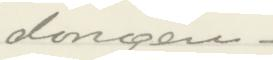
dongen
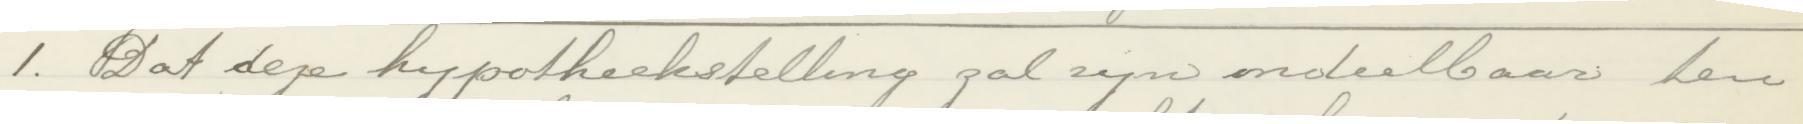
1. Dat deze hypotheekstelling zal zijn ondeelbaar ten
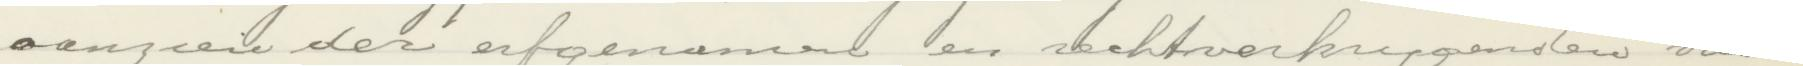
aanzien der erfgenamen en rechtverkrygenden van
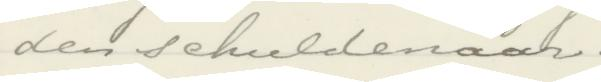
den schuldenaar
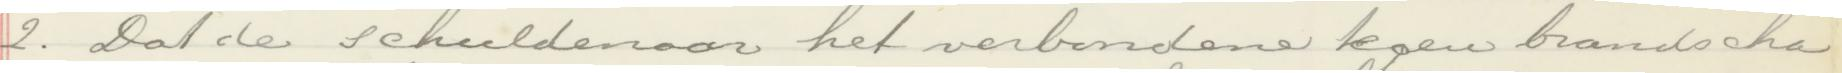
2. Dat de schuldenaar het verbondene tegen brandscha
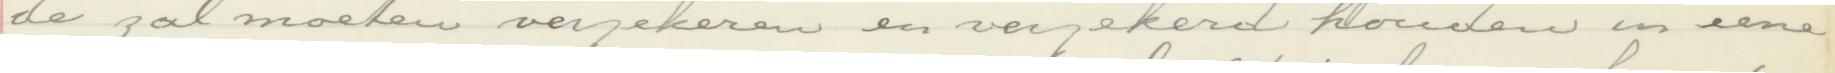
de zal moeten verzekeren en verzekerd houden in eene
